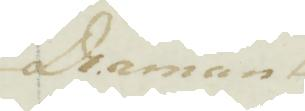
Diamant
